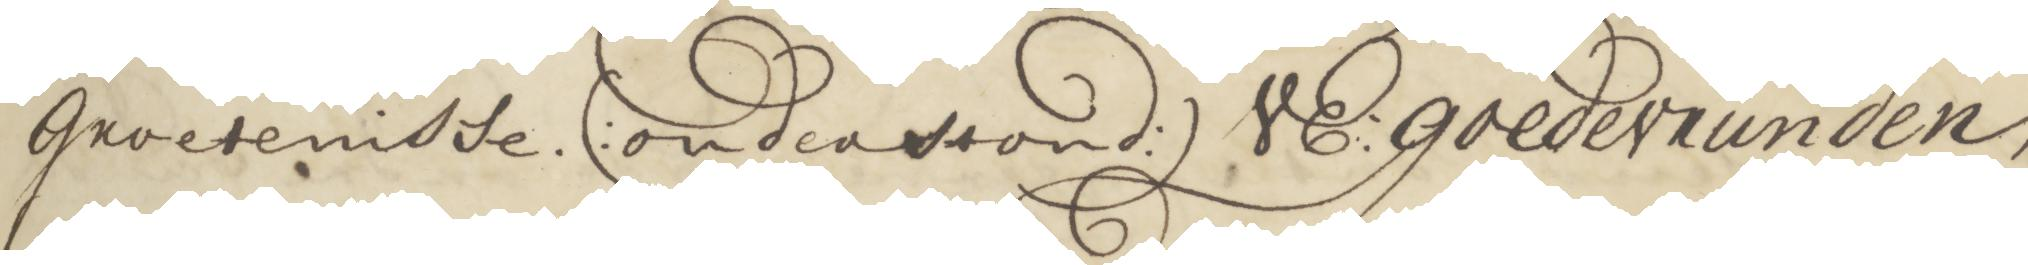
groetenisse (:onderstond:) VE: goedevrunden
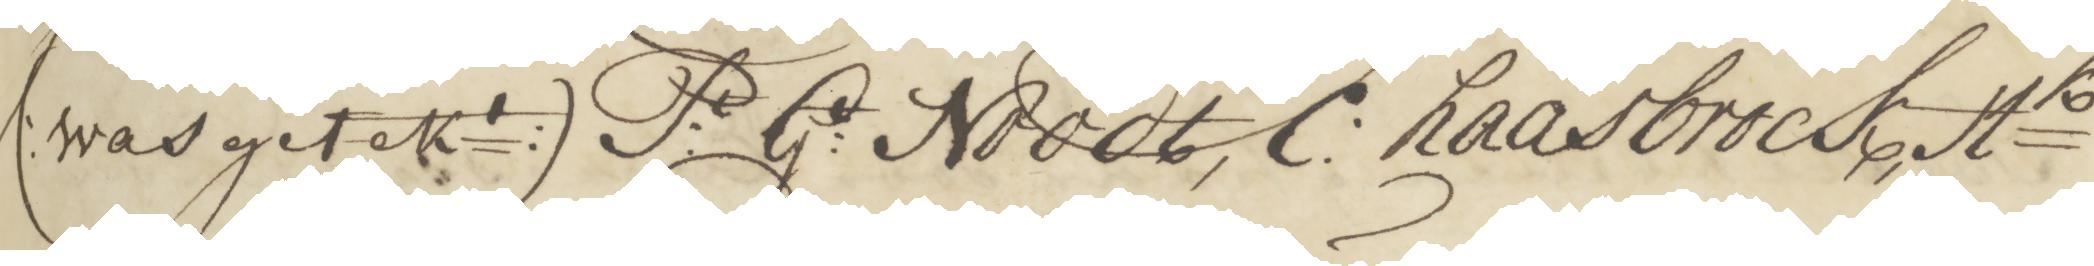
(:was getek=t:) P:t G:t Noodt, C: haasbroek, H=k
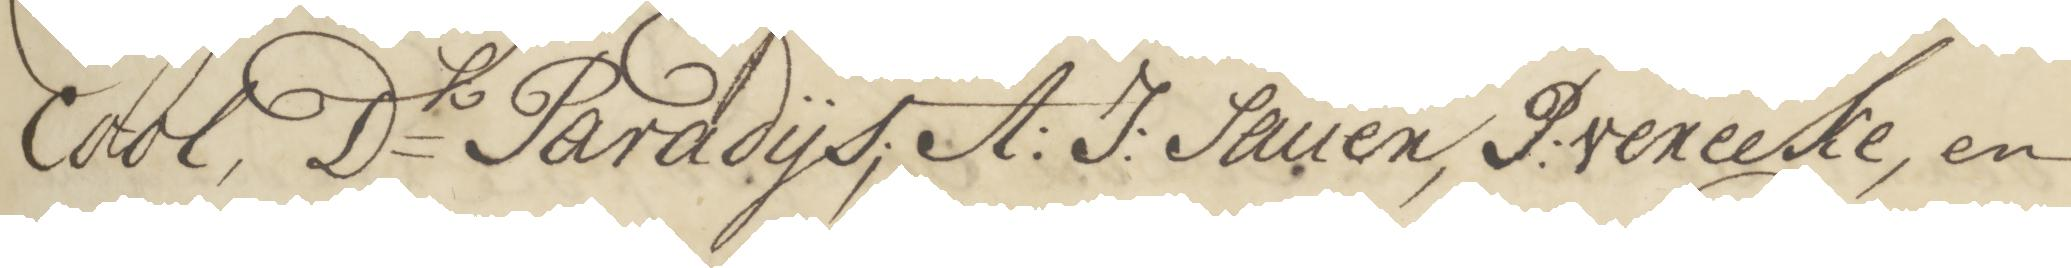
cool, D=k Paradijs; A: I: sauer, P: vereeke, en
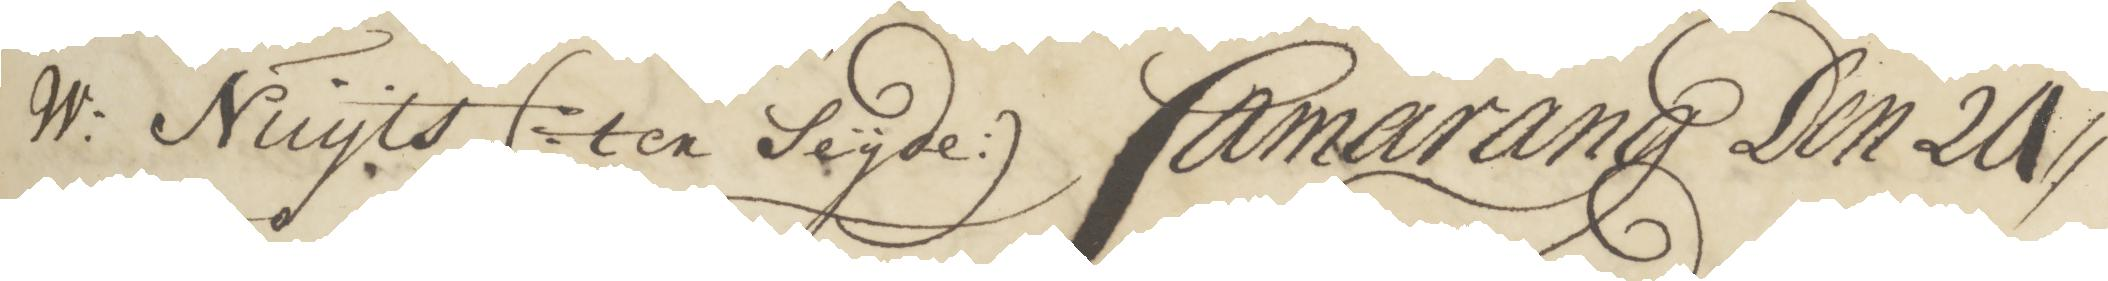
W: Nuijts, (:ter seijde:) Samarang Den 24„e
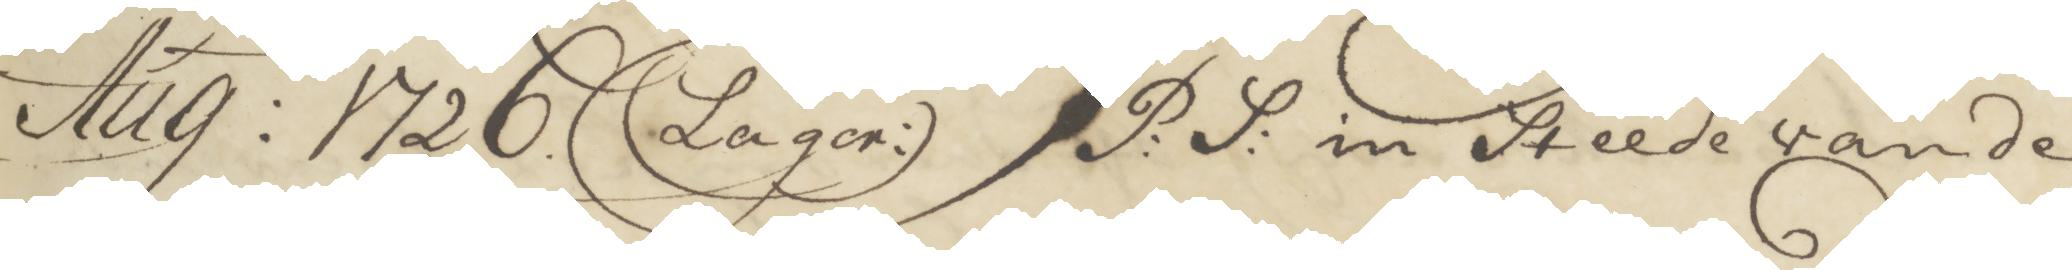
Aug: 1726. (Lager:) P: S: in Steede van den
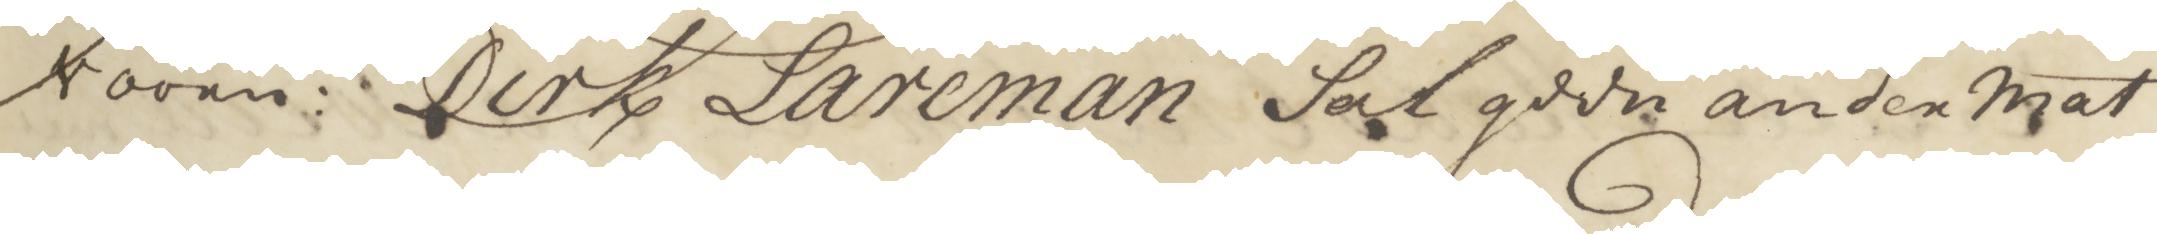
voorn: Dirk Lareman sal geen ander mat
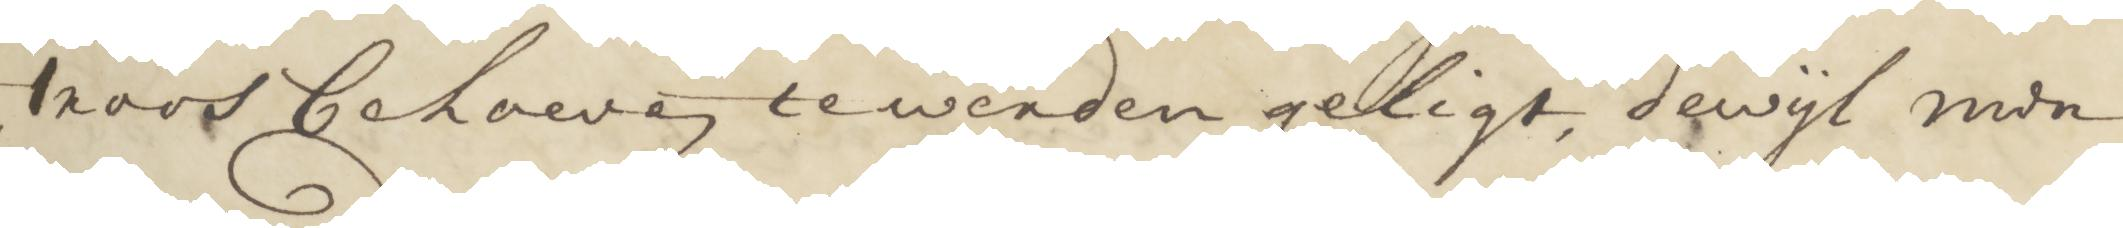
troos behoeven te werden geligt, dewijl men
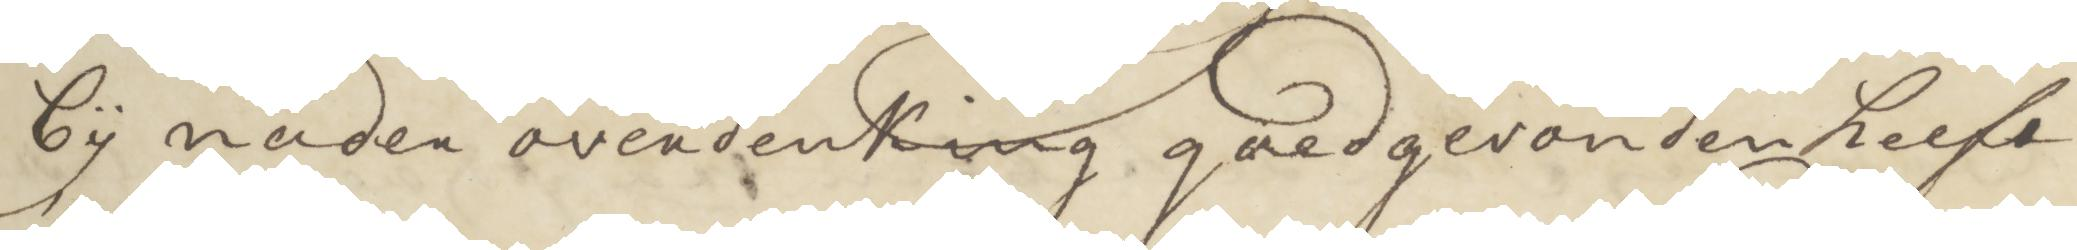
bij nader overdenking goedgevonden heeft
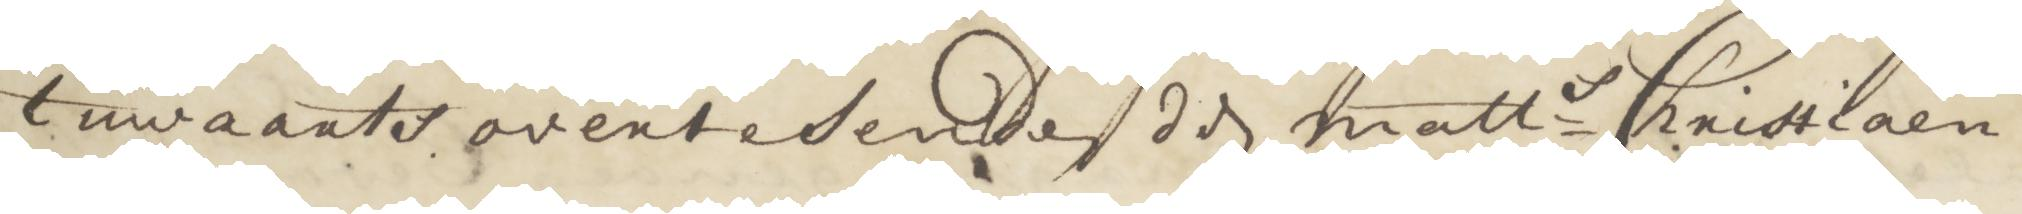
tuwaarts overtesenden den matt=s Christiaen
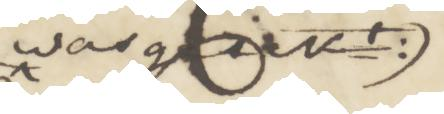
(was getek=t:)
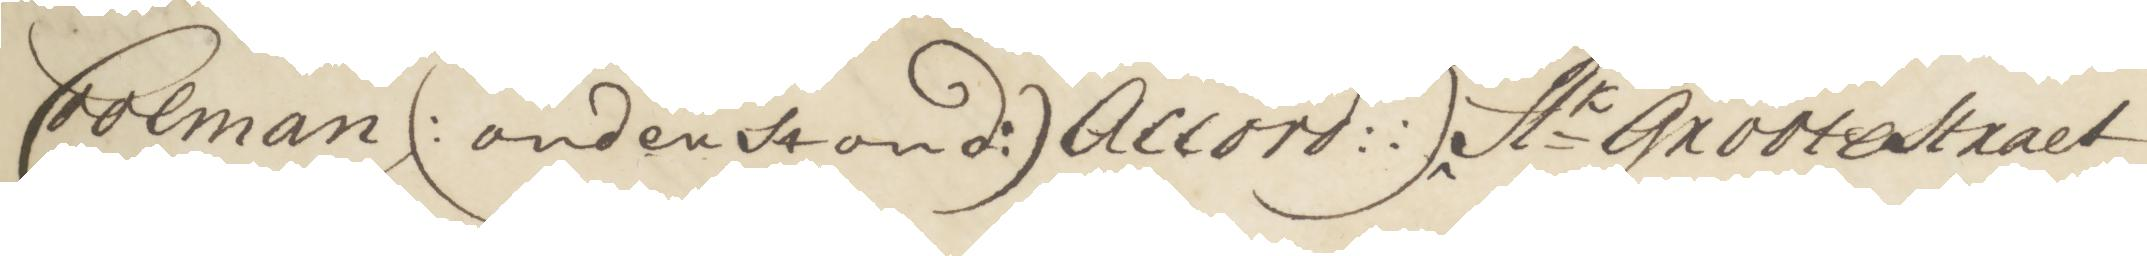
Coolman (:onderstond:) Accord:t:) H=k grootestraet
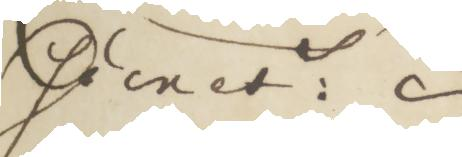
secret:s —.
